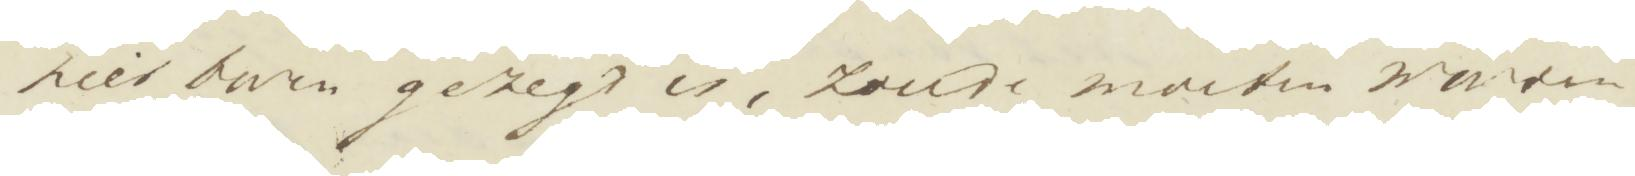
hier boven gezegd is, zoude moeten worden
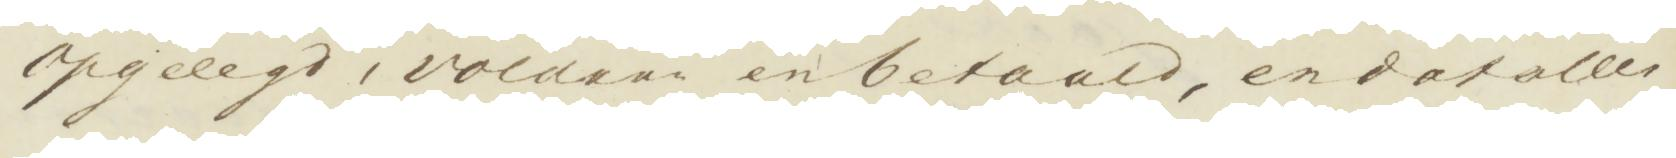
opgelegd, voldaan en betaald, en dat alles
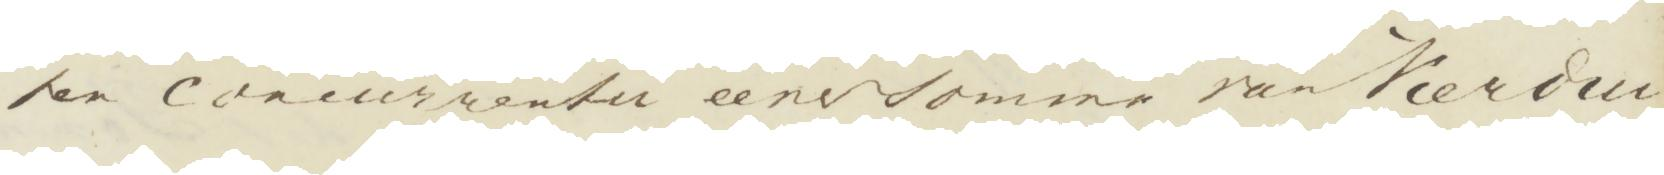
ter concurrentie eene somma van Vierdui
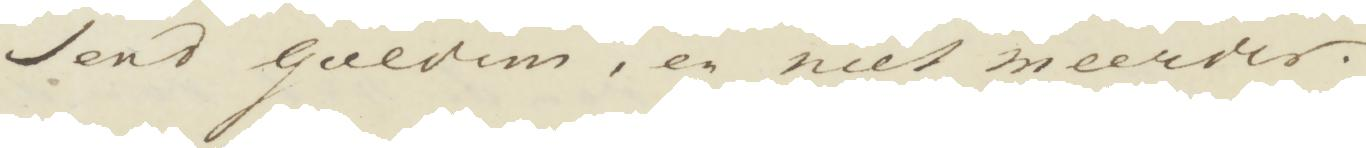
send guldens, en niet meerder.
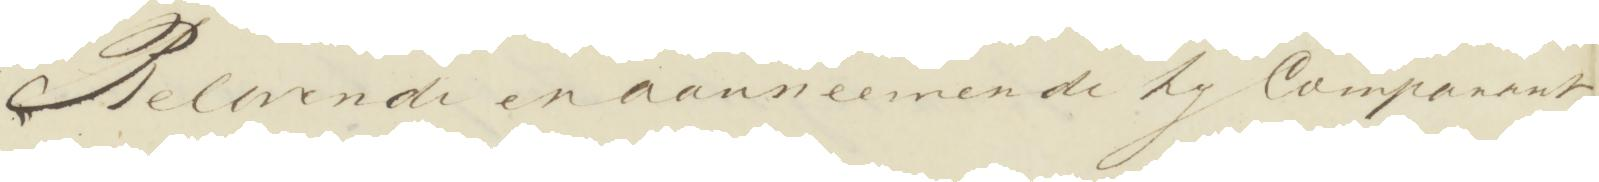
Belovende en aanneemende hy Comparant
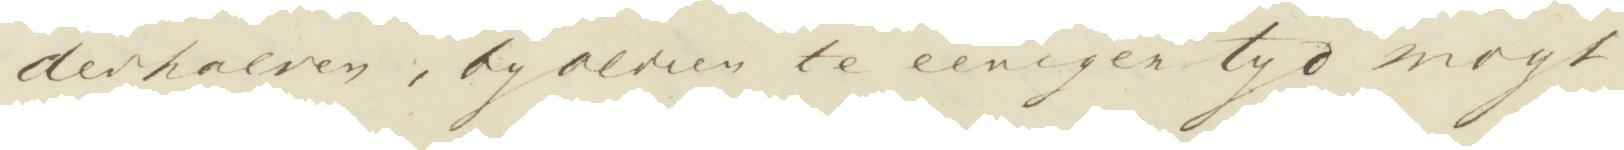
derhalven, by aldien te eenigen tyd mogt
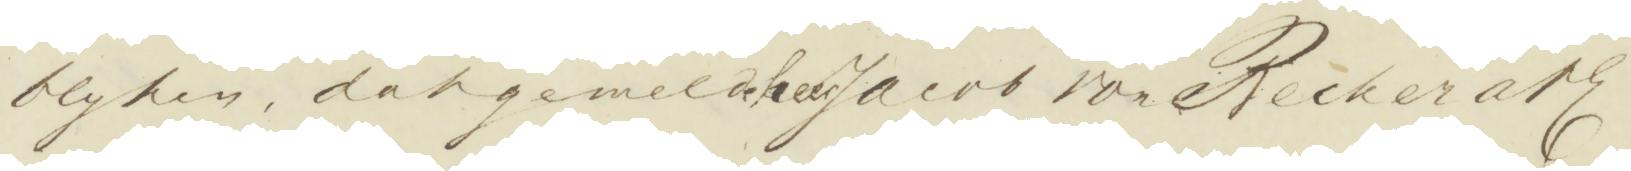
blyken, dat gemelde heer Jacob von Beckerath
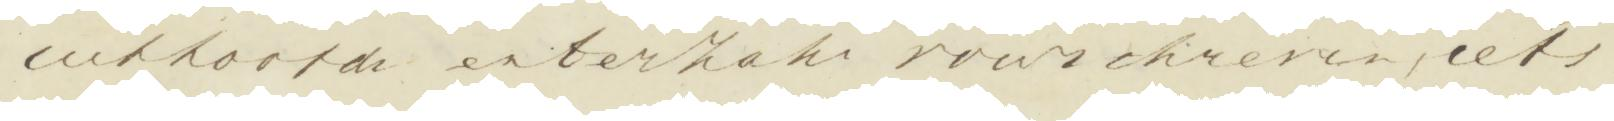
uithoofde en terzake voorschreven, iets
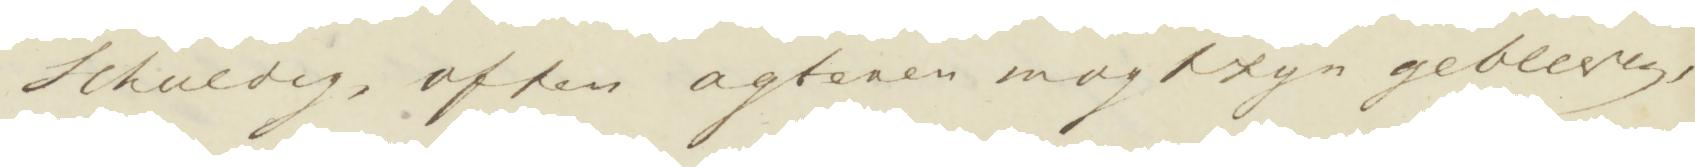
schuldig, of ten agteren mogt zyn gebleven,
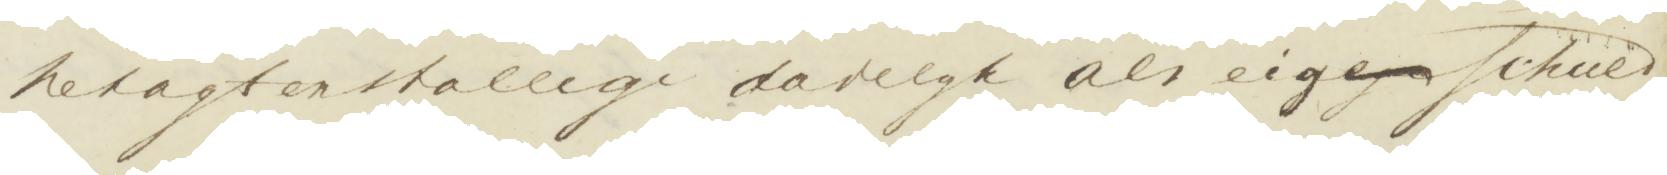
het agterstallige dadelyk als eigen schuld,
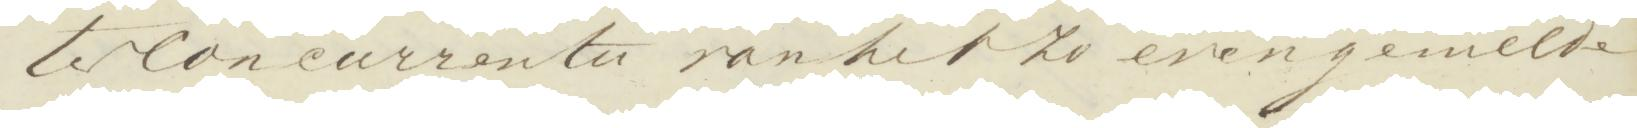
ter concurrentie van het zo even gemelde
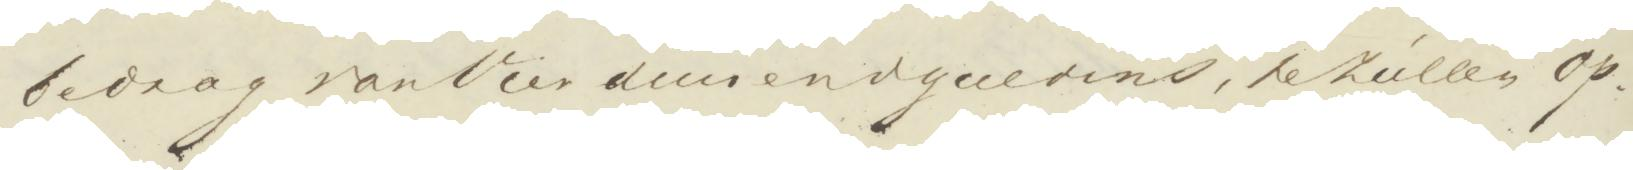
bedrag van Vier duisend guldens, te zullen op„
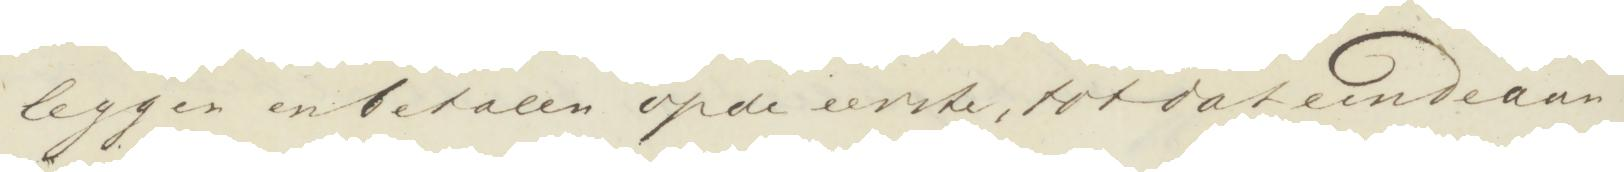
leggen en betalen op de eerste, tot dat einde aan
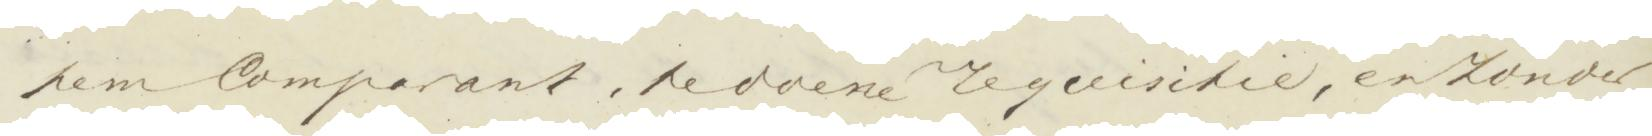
hem Comparant, te doene requisitie, en zonder
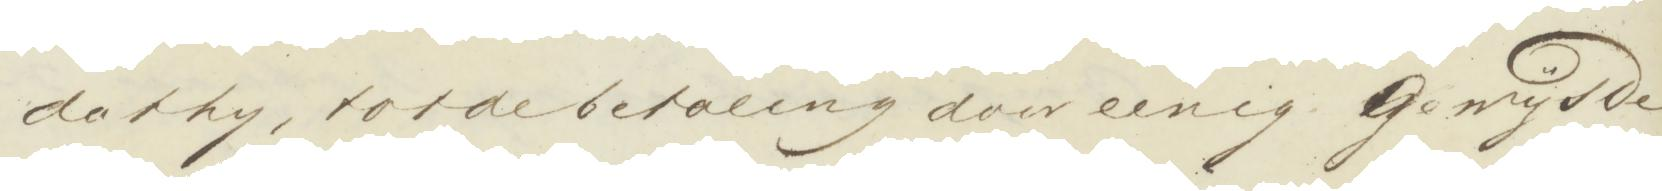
dat hy, tot de betaling door eenig Gewijsde
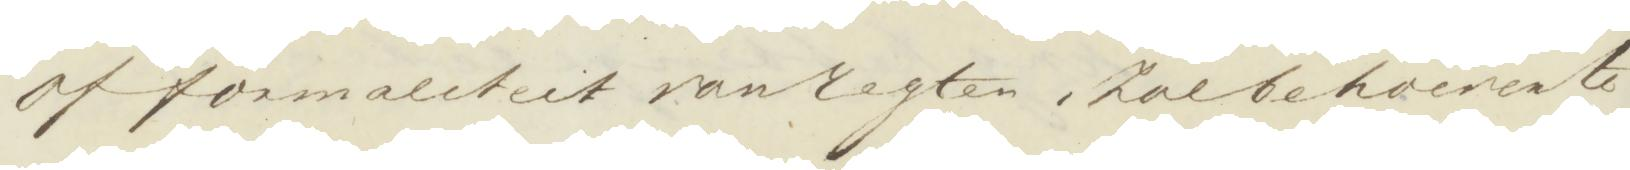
of formaliteit van regten, zal behoeven te
